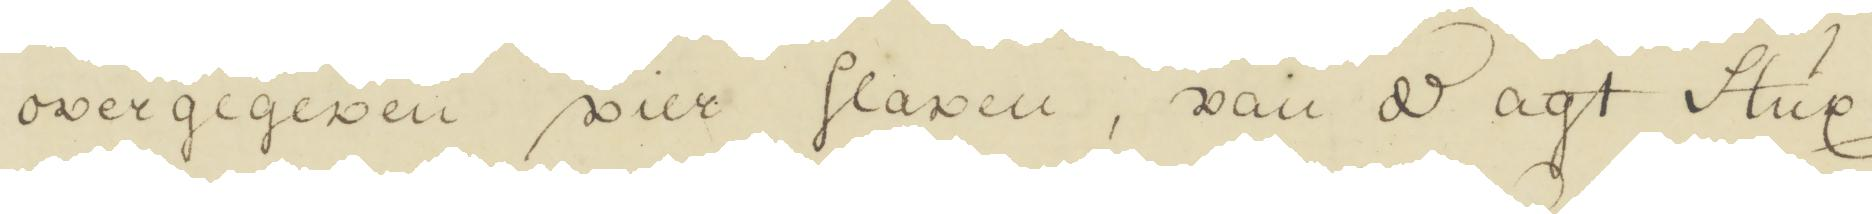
overgegeven vier slaven, van de agt stux
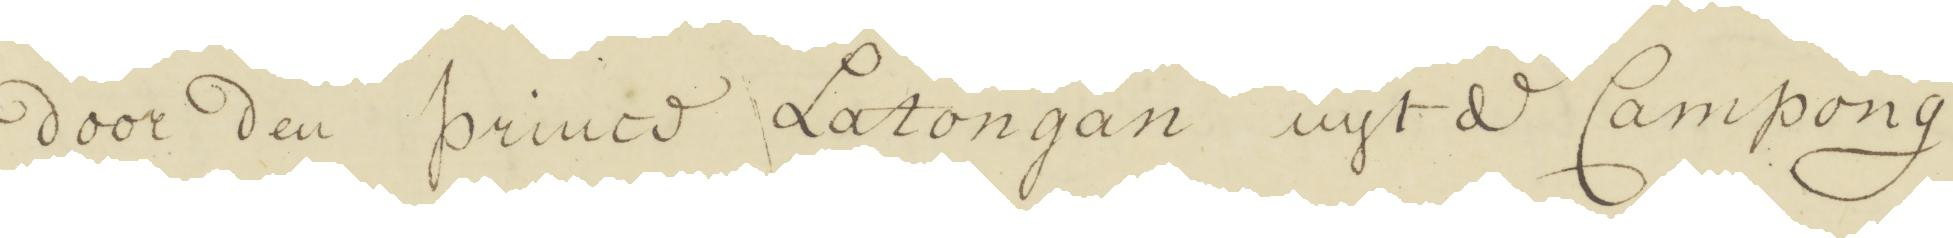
door den prince Latongan uijt de Campong
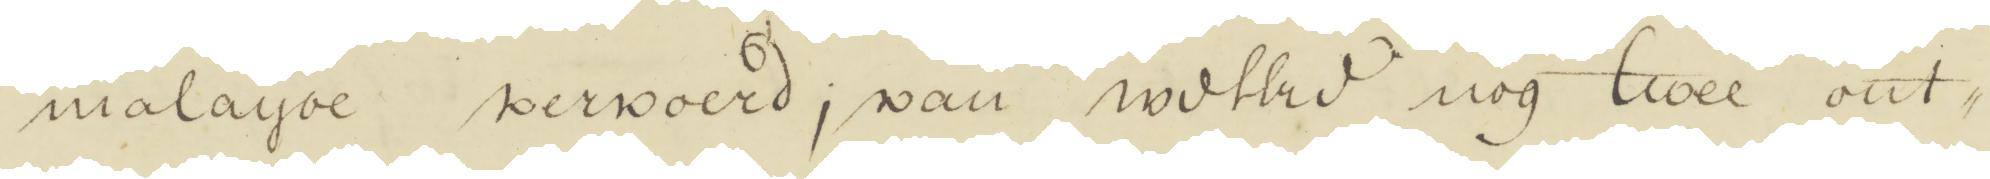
malaijoe vervoerd; van welke nog twee ont„
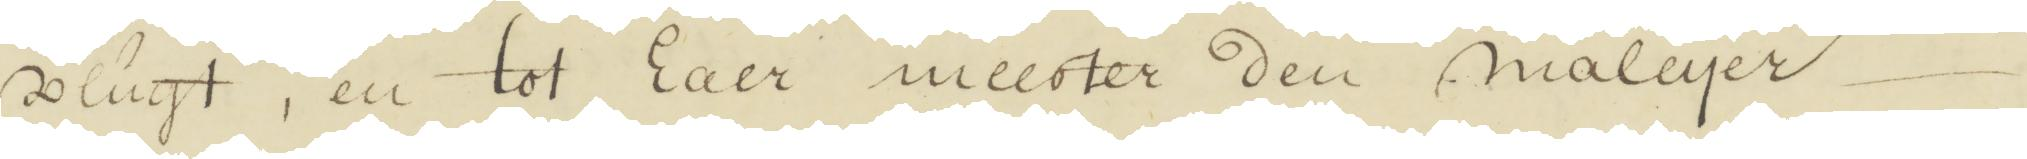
vlugt, en tot haer meester den maleijer
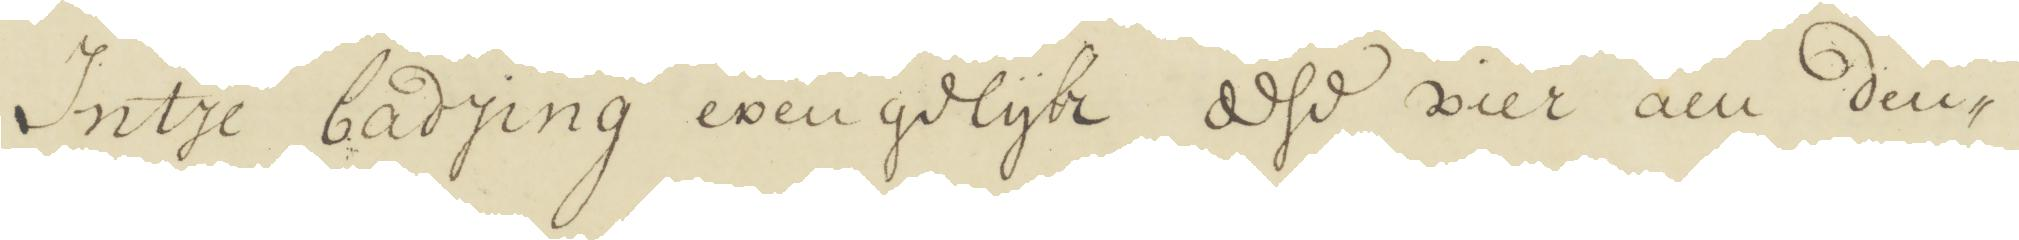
Intje badjing even gelijk dese vier aen den„
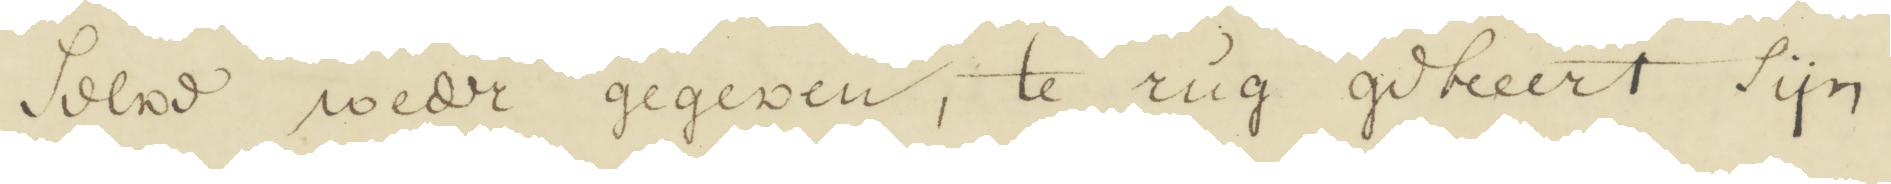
selve weder gegeven, te rug gekeert sijn
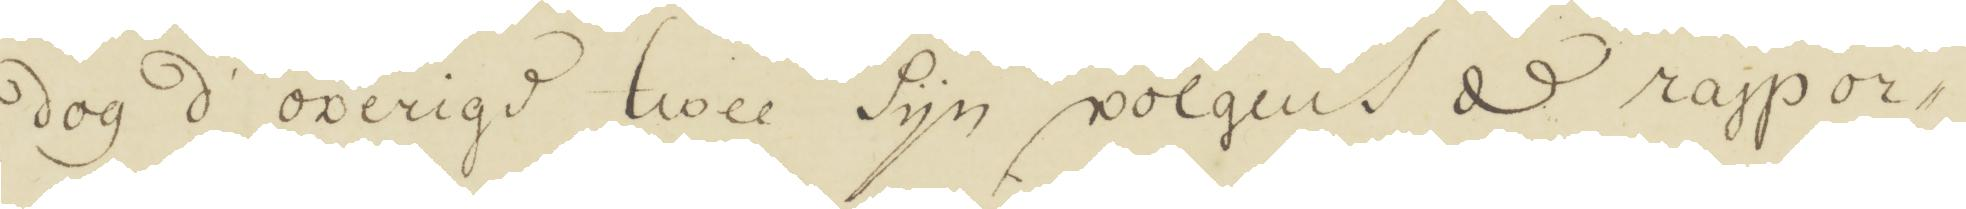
dog d’ overige twee sijn volgens de rappor„
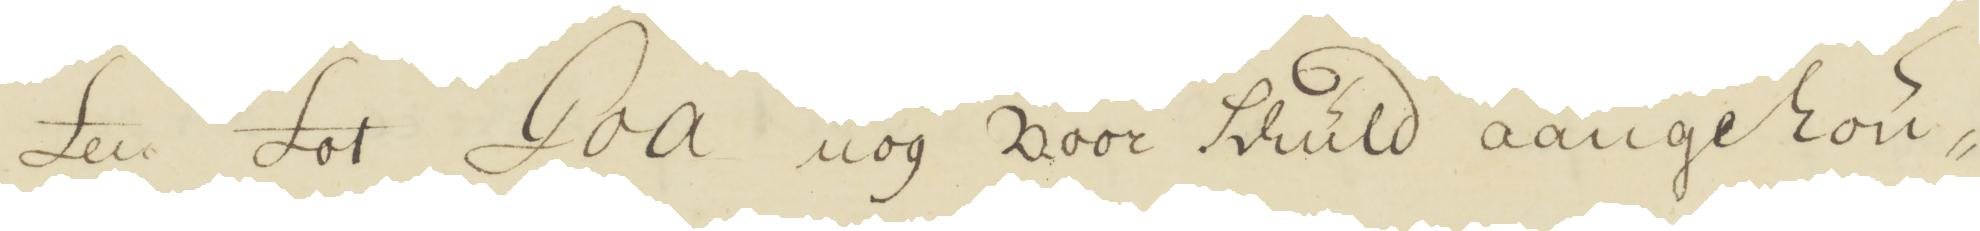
ten tot Goa nog voor schuld aangehou„
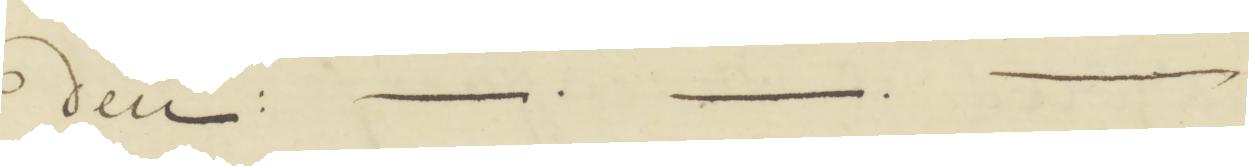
den: — . — . —
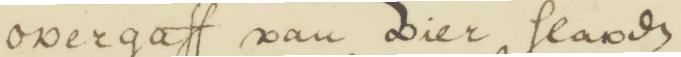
overgaff van vier slaven
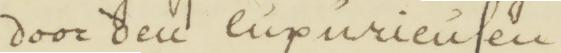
door den luxurieusen
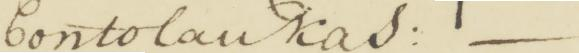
bontolankas: —
